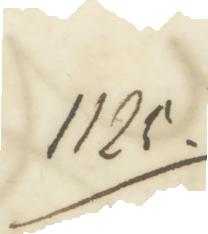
1125.
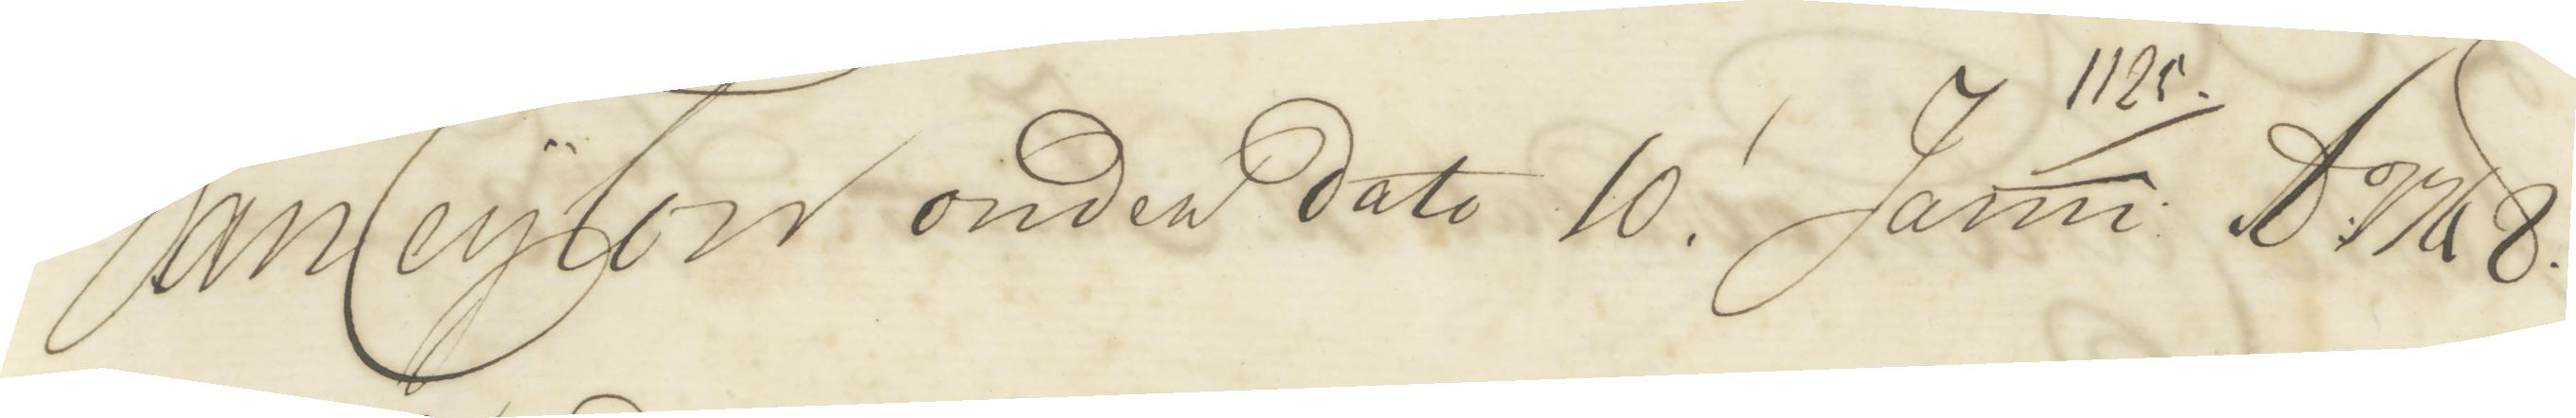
Van Ceijlon onder dato 10.' Jann: A:o 1748.
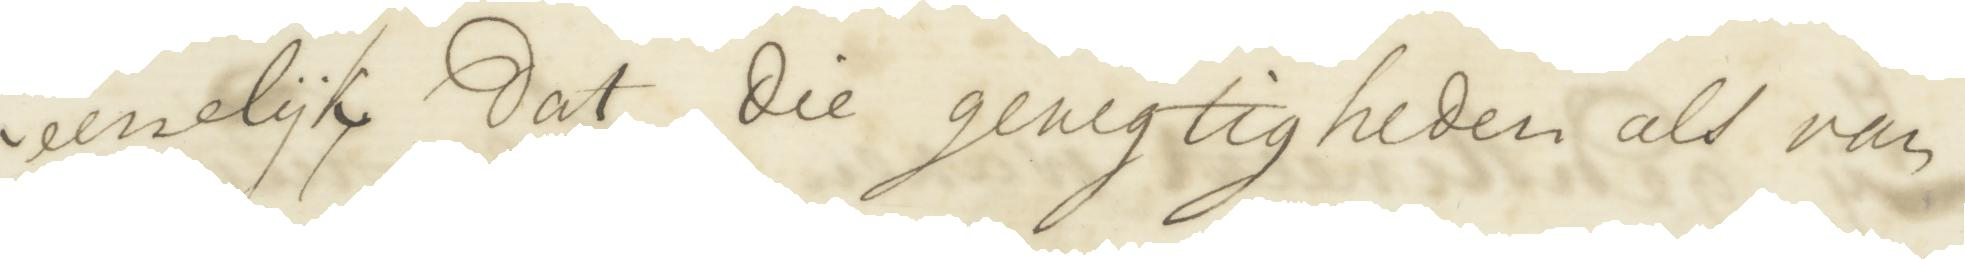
eenelijk dat die geregtigheden als van
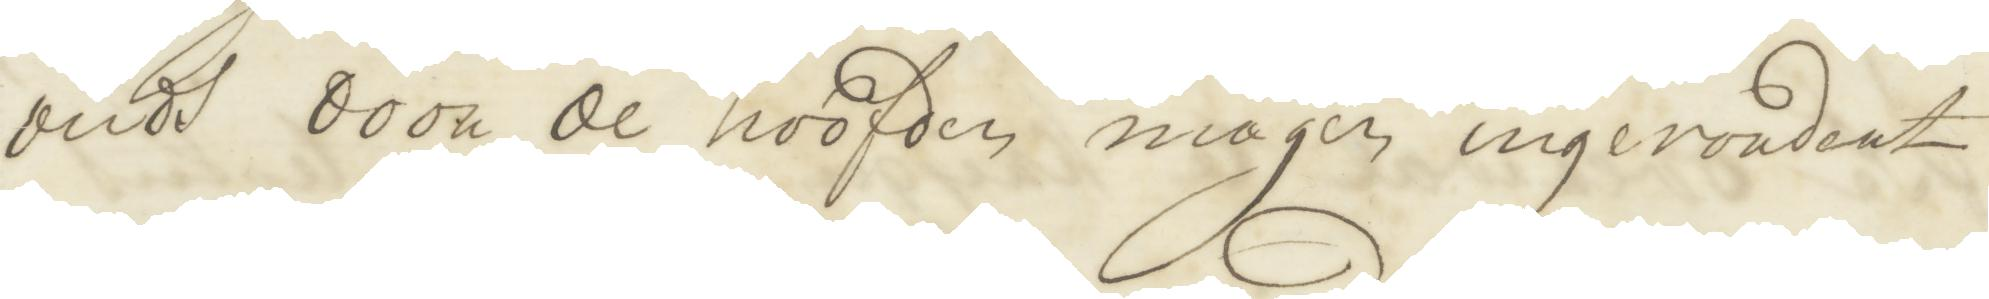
ouds door de hoofden mogen ingevordert
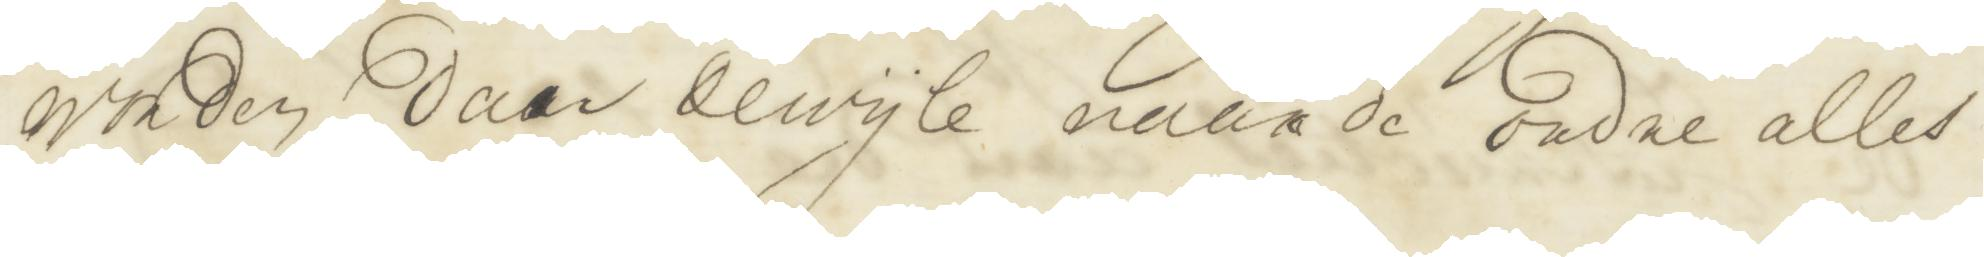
worden daar dewijle naar de ordre alles
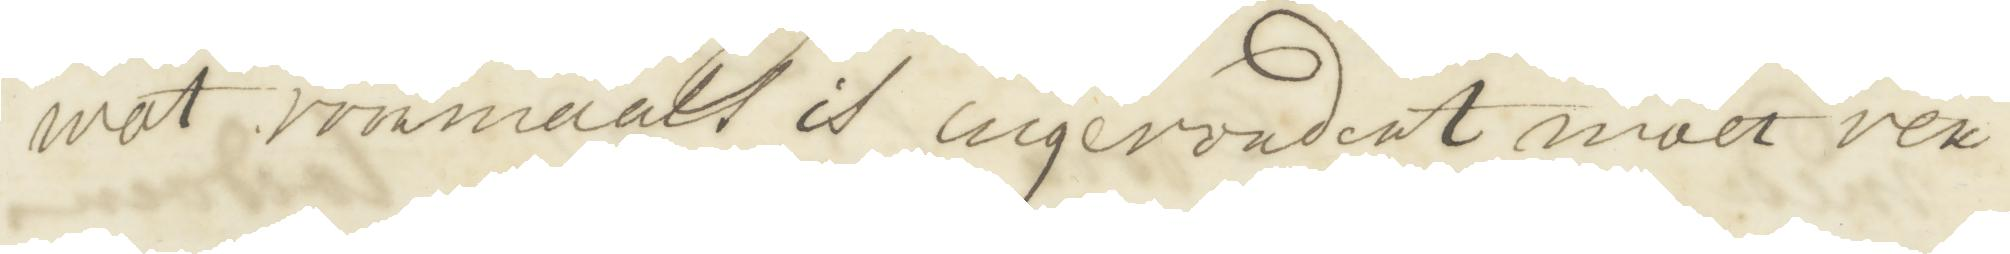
wat voormaals is ingevordert moet ver
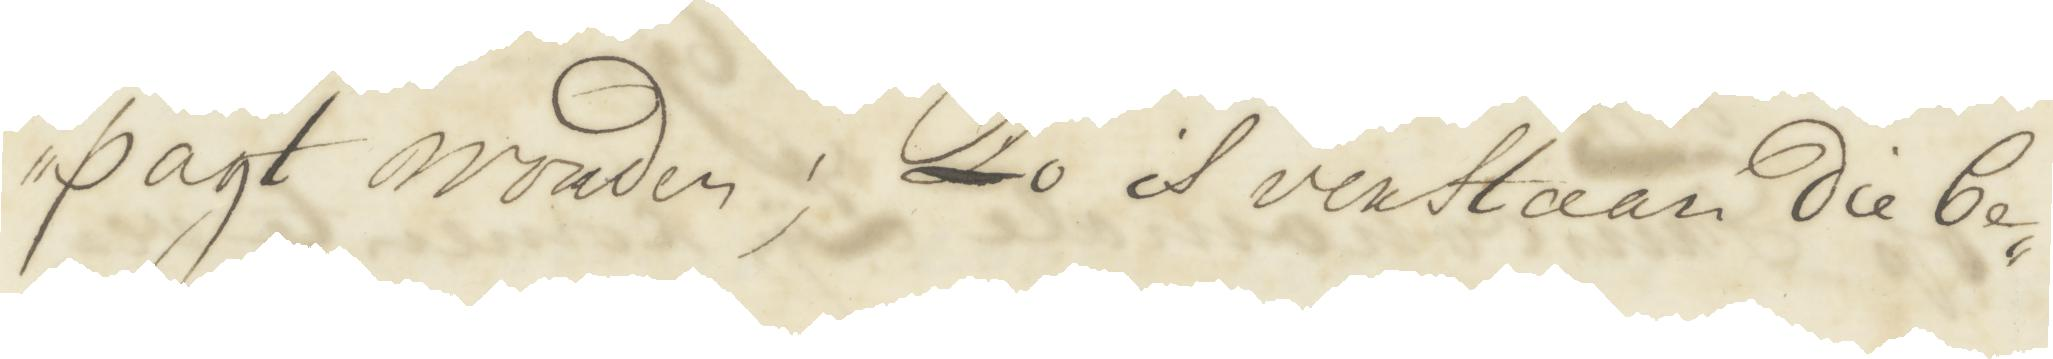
„pagt worden, zo is verstaan die be„
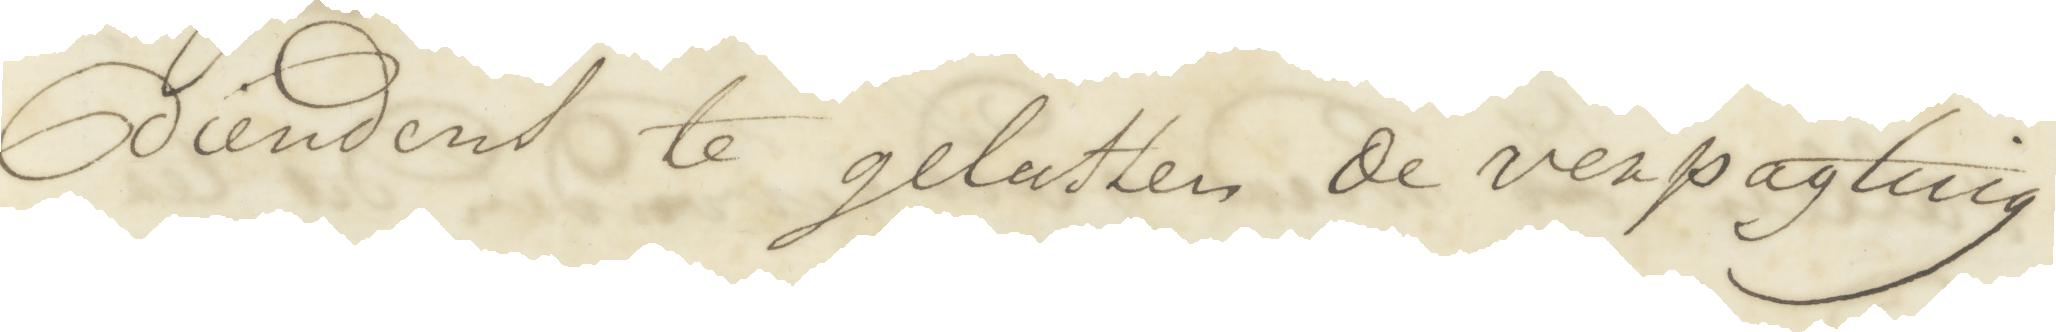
diendens te gelasten de verpagting
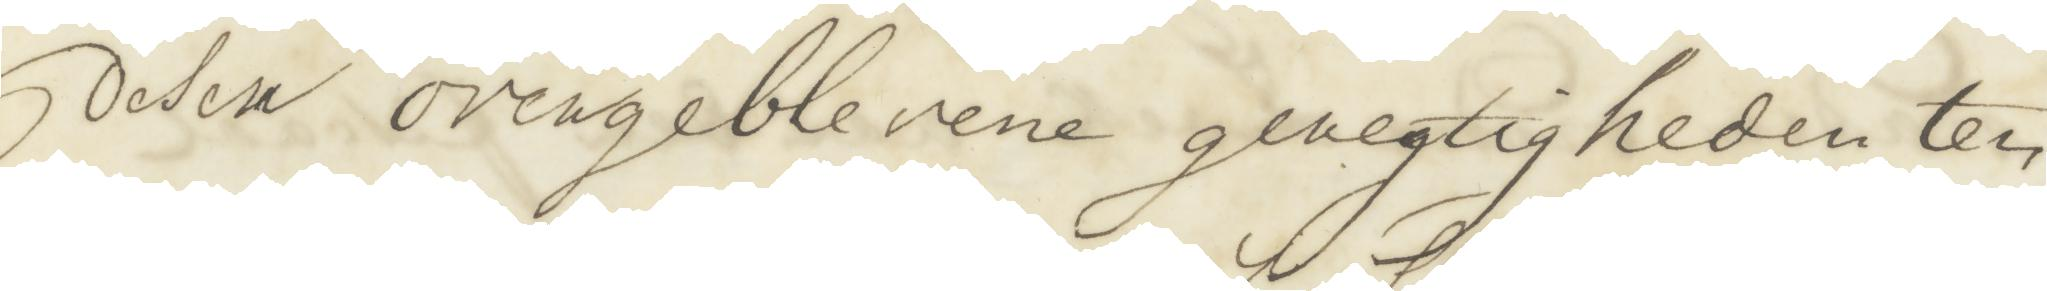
deser overgeblevene geregtigheden ten
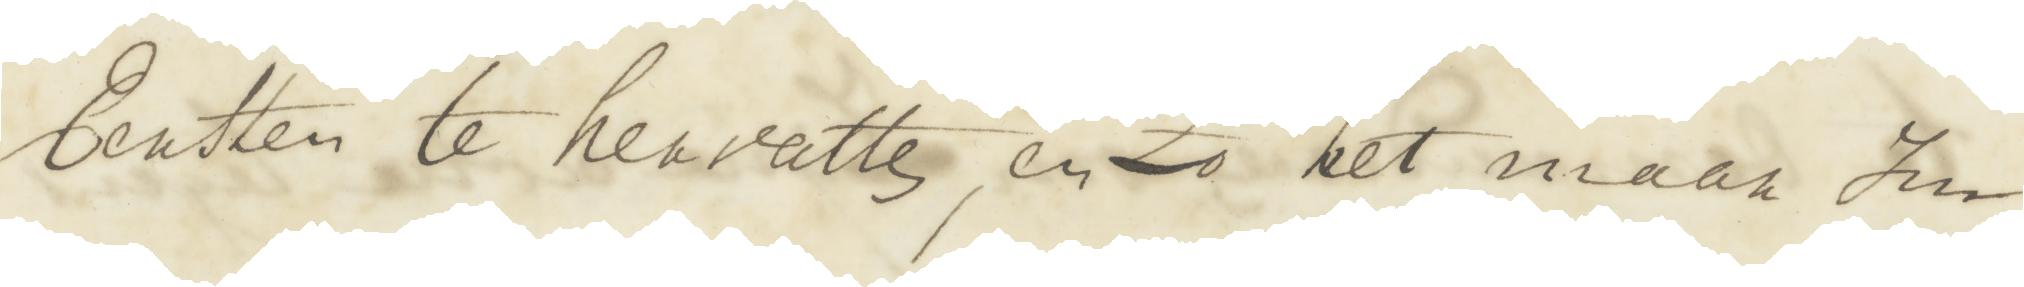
Eersten te hervatten, en zo het maar Im
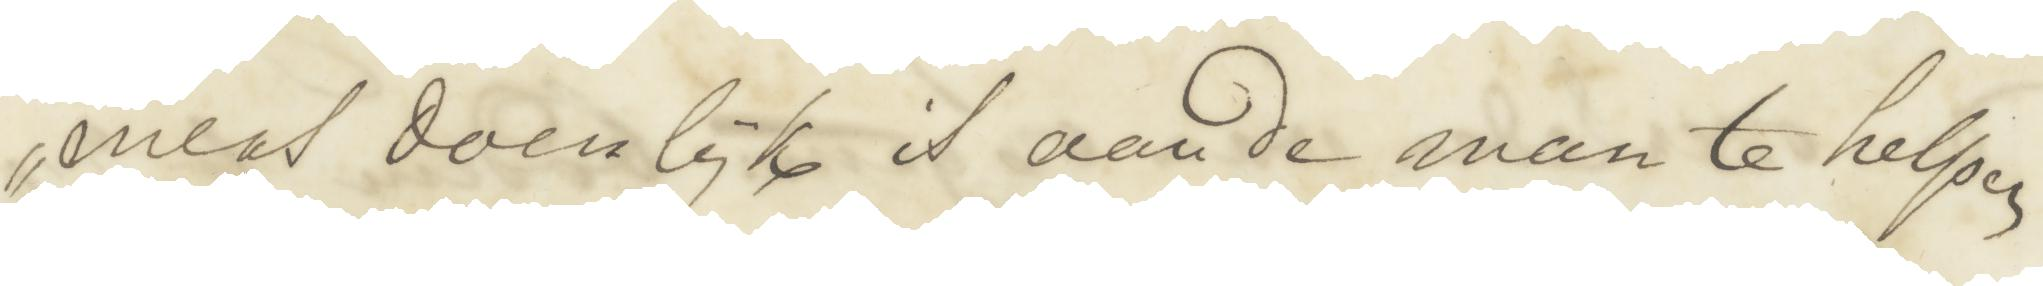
„mers doenlijk is aan de man te helpen
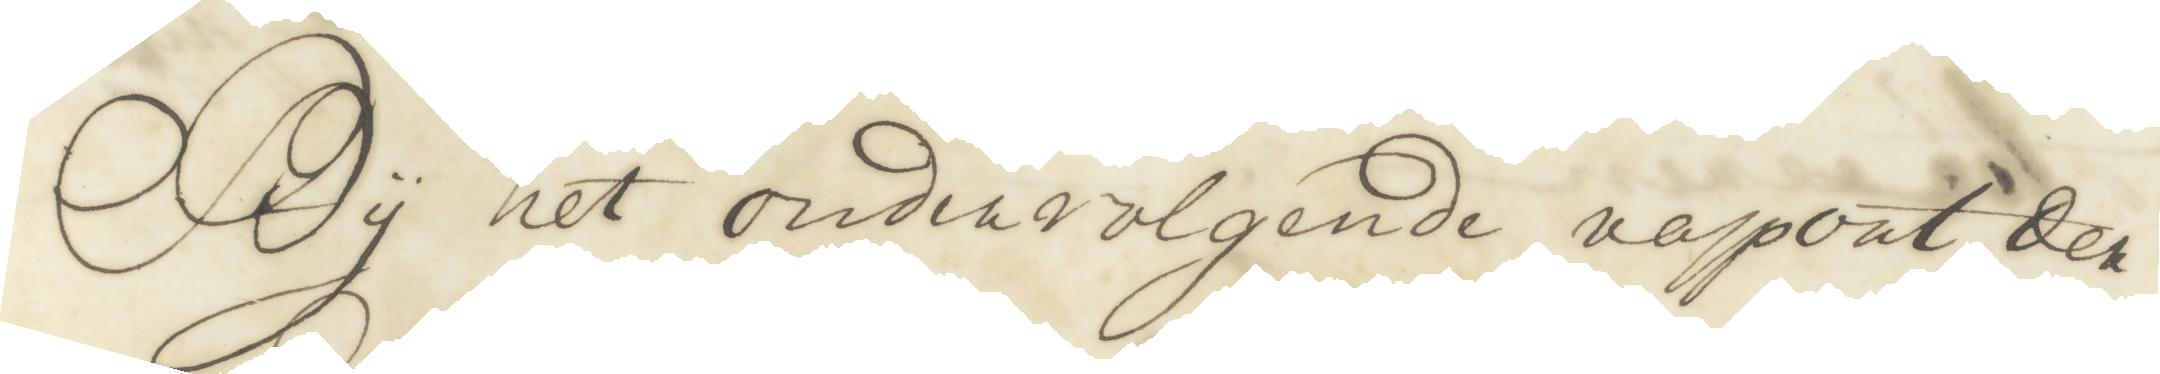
Bij het ondervolgende rapport der
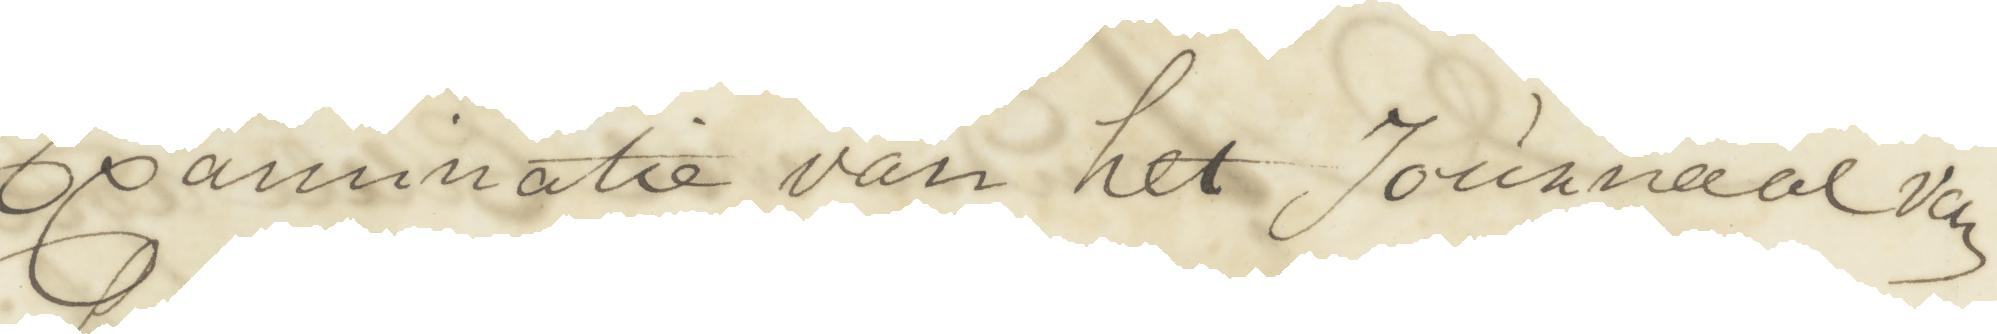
Examinatie van het Journaal van
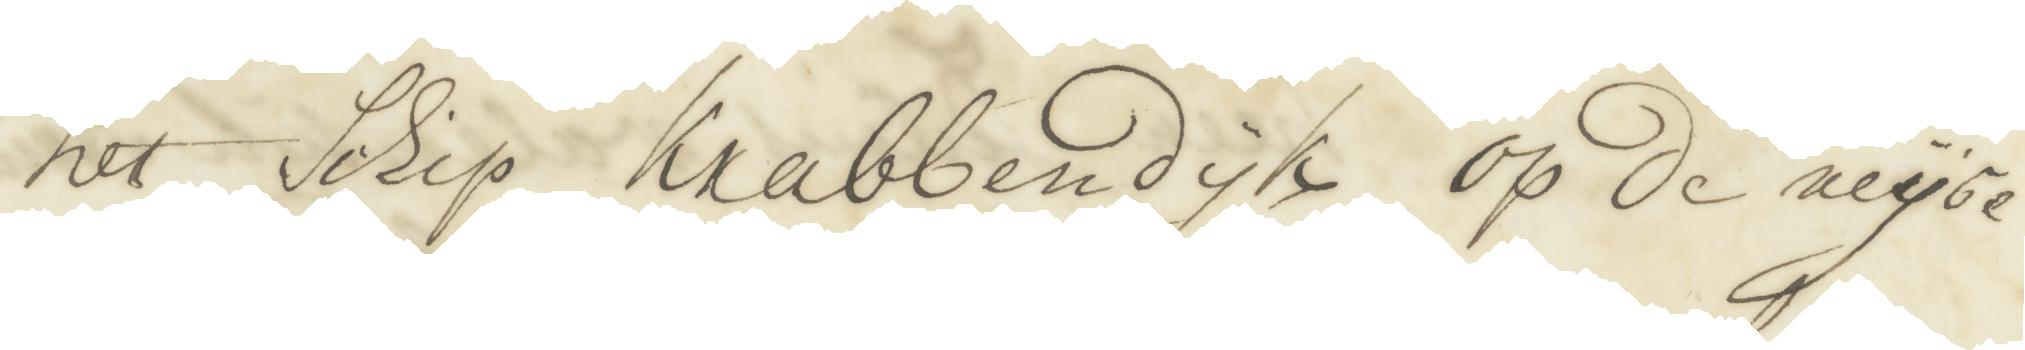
het schip krabbendijk op de reijse
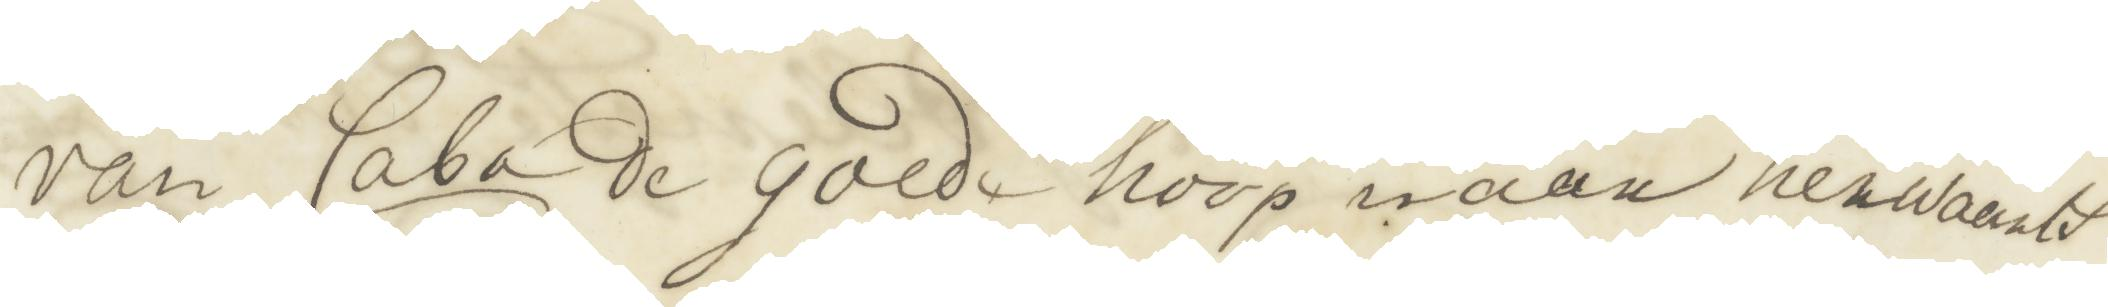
van Cabo de goede hoop naar herwaarts
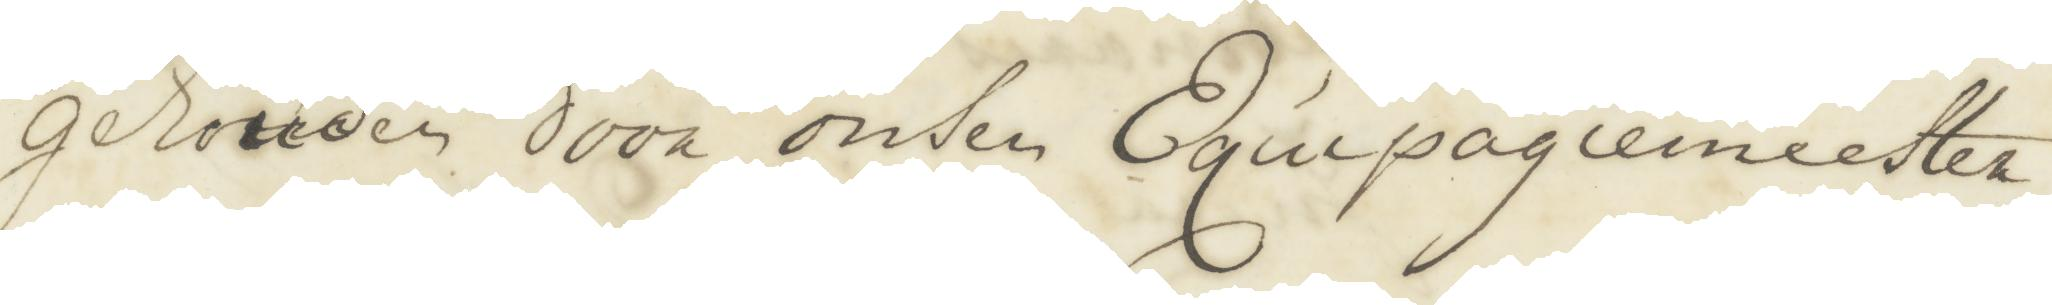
gehouden door onsen Equipagiemeester
